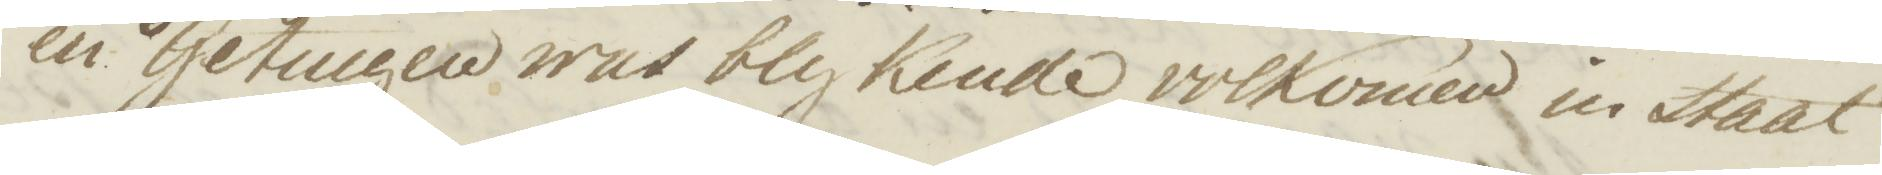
en Getuigen was blykende volkomen in staat
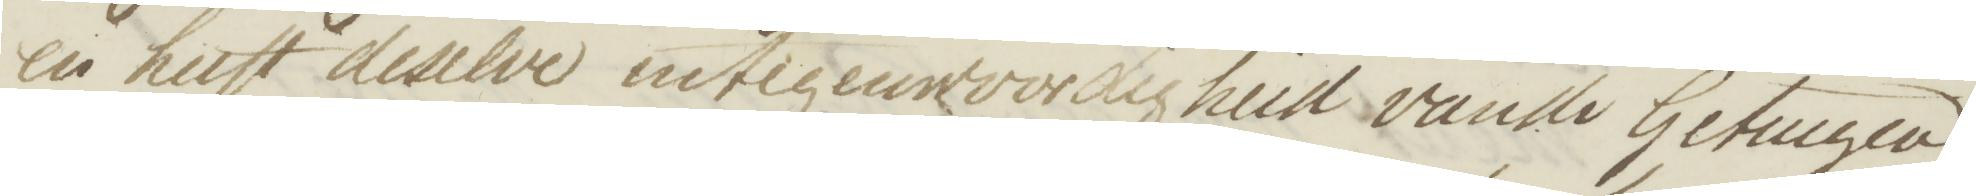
en heeft dezelve integenwoordigheid vande Getuigen
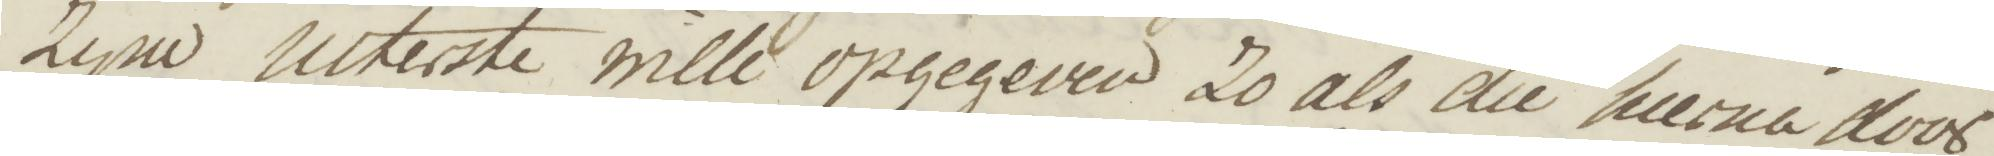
Zyne uiterste wille opgegeven Zo als die hierna door
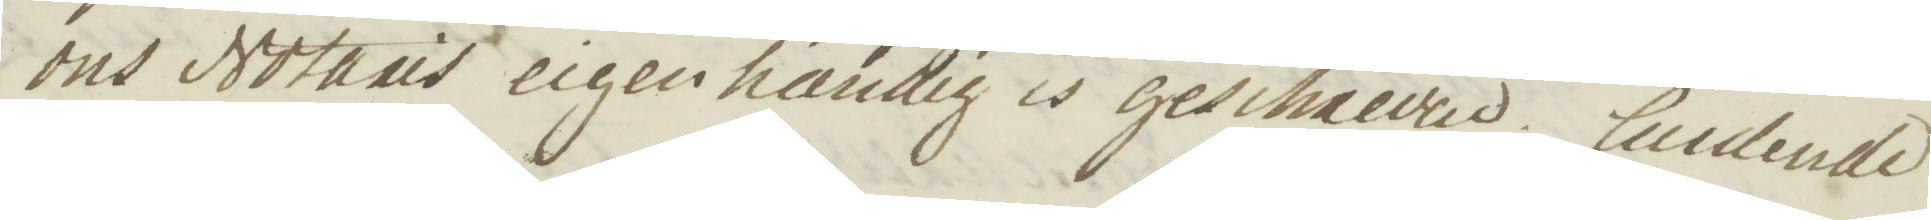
ons Notaris eigenhandig is geschreven luidende
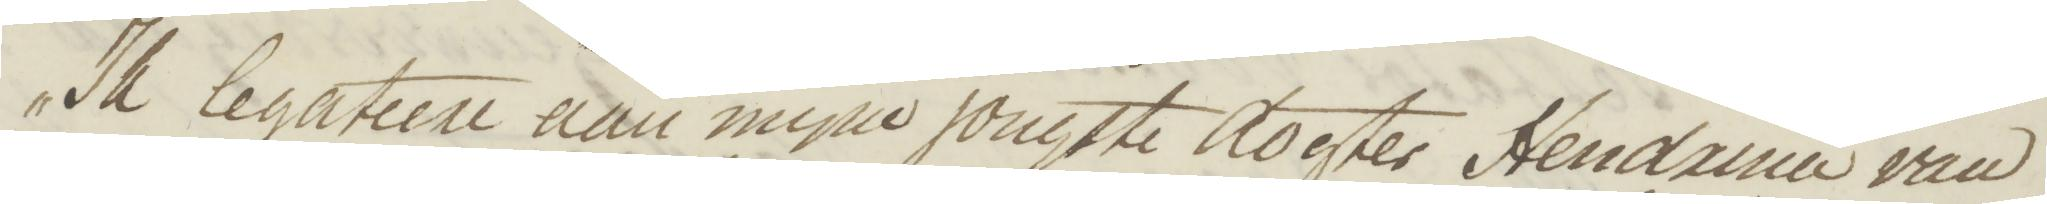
„Ik legateere aan myne jongste dogter Hendrina van
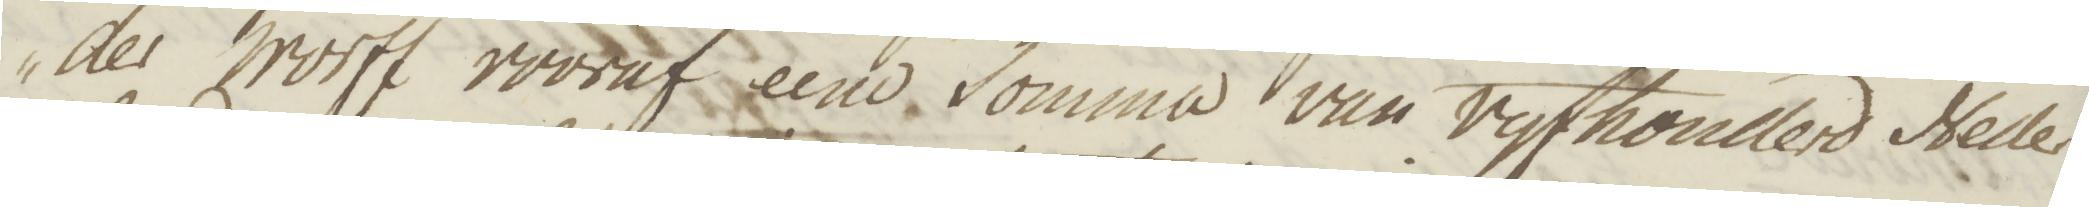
„der Worff vooraf eene Somma van vyfhonderd Neder
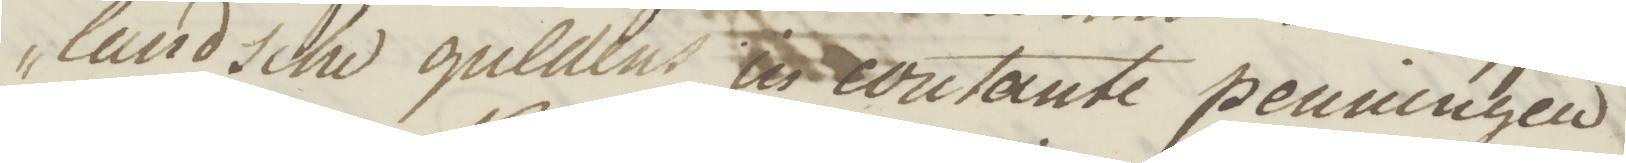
„landsche guldens in contante penningen
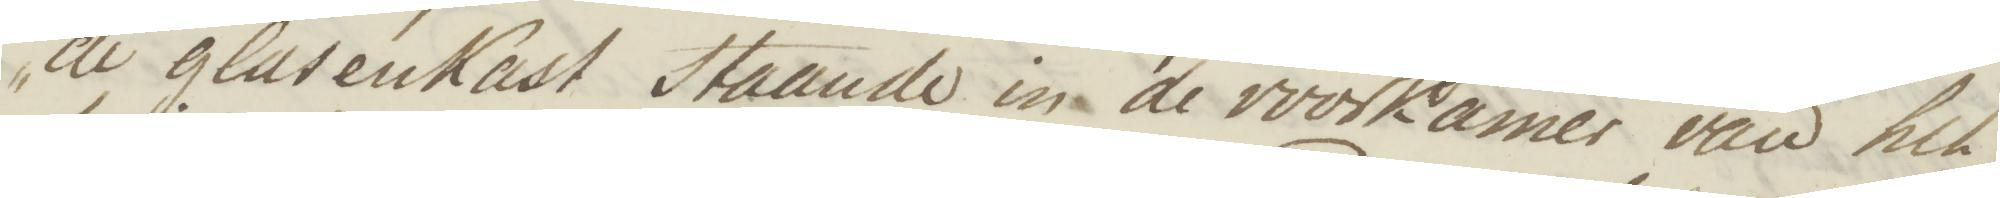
„de glasen Kast staande in de voorkamer van het
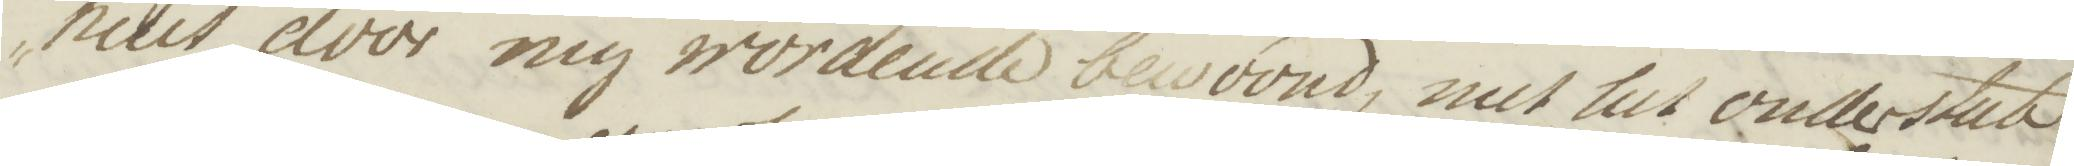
„huis door my wordende bewoond, met het onderstuk
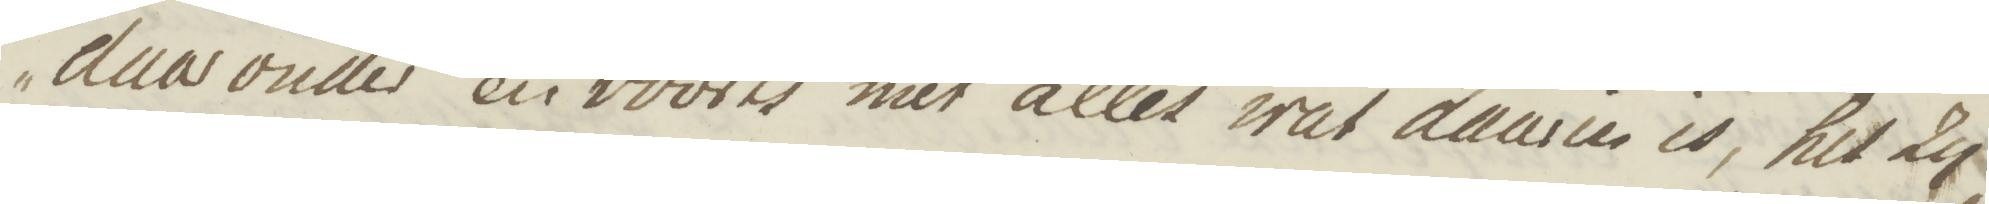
„daar onder en voorts met alles was daarin is, het zy
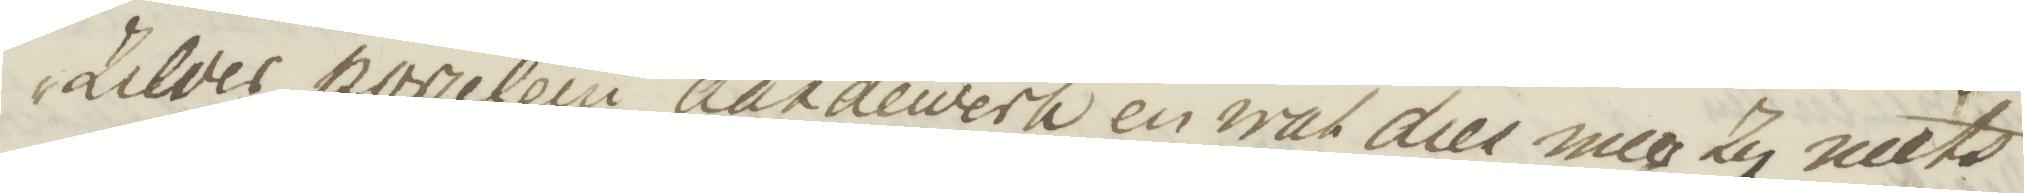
„Zilver porcelein aardewerk en wat dies meer Zy niets
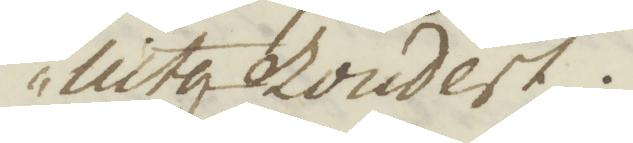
„uitgezondert.
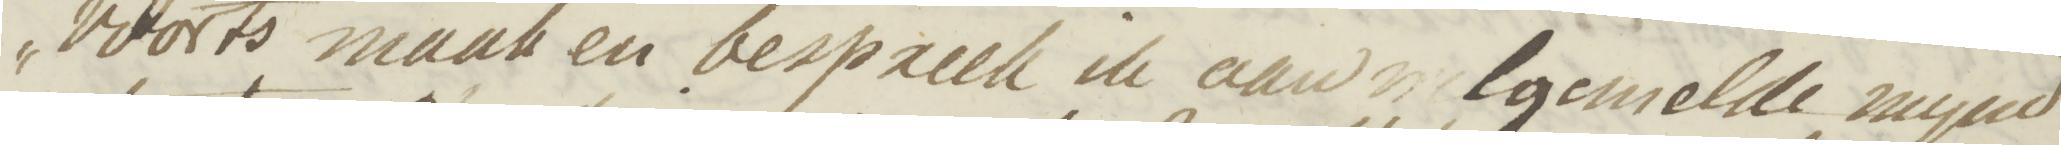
„voorts maak en bespreek ik aan welgemelde myne
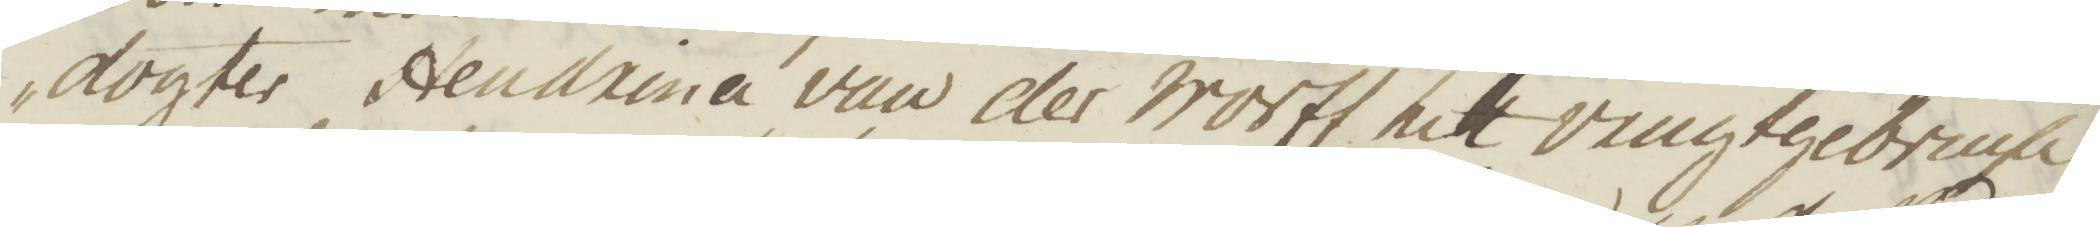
„dogter Hendrina van der Worff het vrugtgebruyk
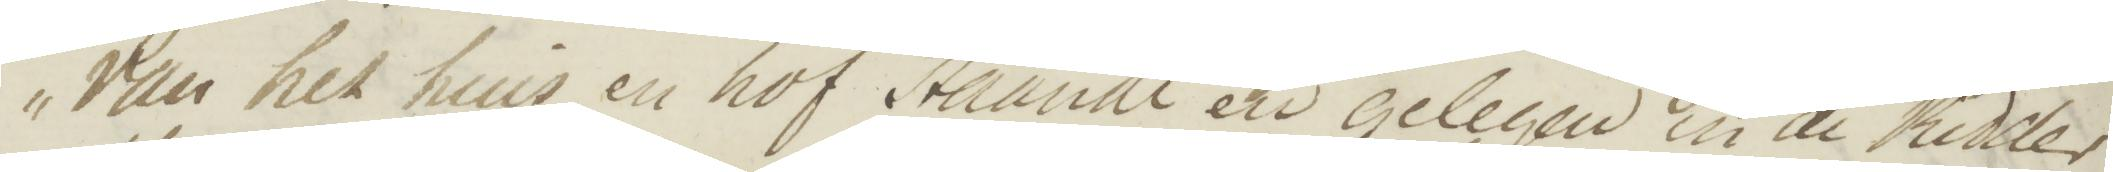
„van het huis en hof staande en gelegen in de Ridder
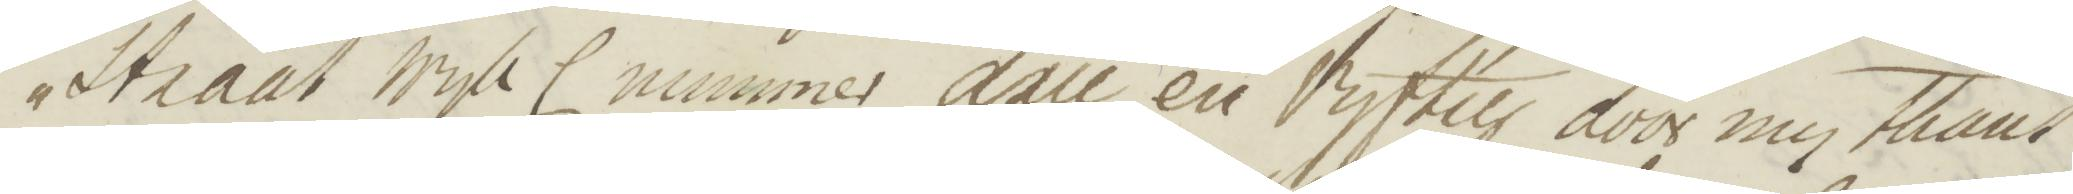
„Straat wyk C nummer drie en Vyftig door my thans
